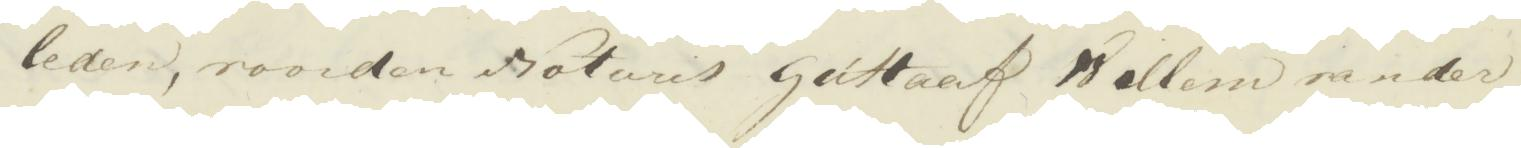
leden, voor den Notaris Gustaaf Willem van der
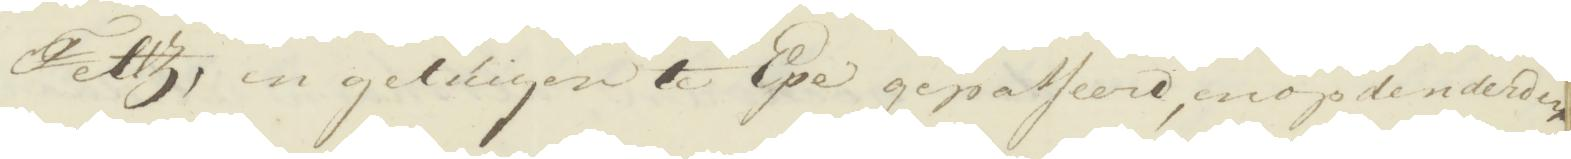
Feltz, en getuigen te Epe gepasseerd, en op den derden
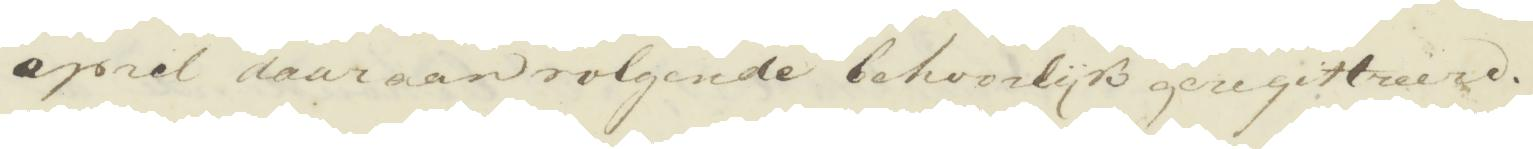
april daar aan volgende behoorlijk geregistreerd.
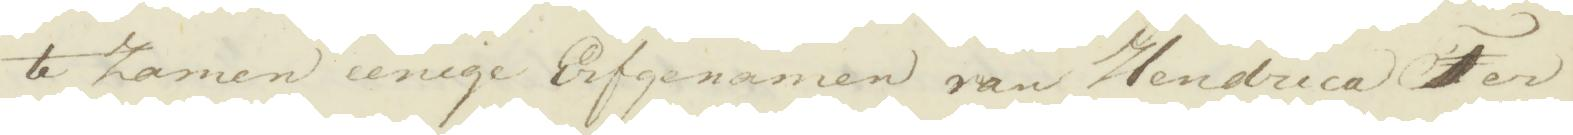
te zamen eenige Erfgenamen van Hendrica Ter
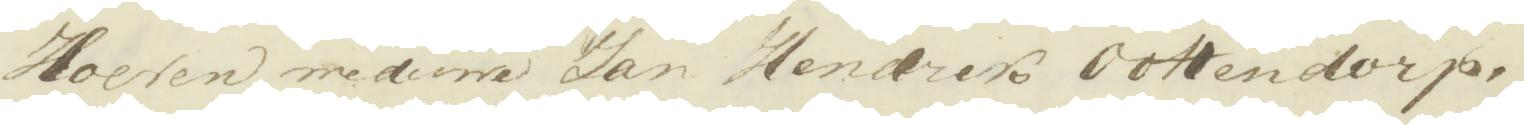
Hoeven, weduwe Jan Hendrik Oostendorp,
